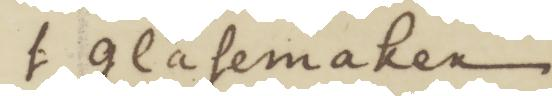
1 glasemaker
